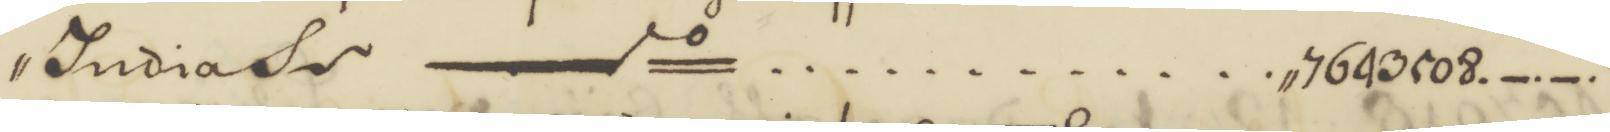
„ Indiase d=o . . . . . . . . . . . . „ 7643508.-.-.
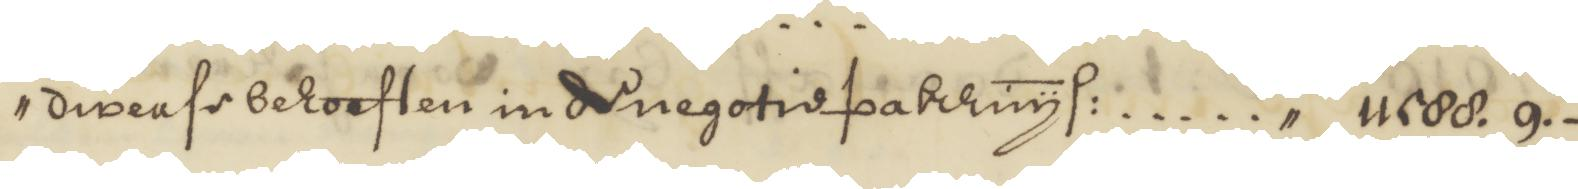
„ diverse behoeften in de negotiepakhuijs: . . . . . „11588.9.-.
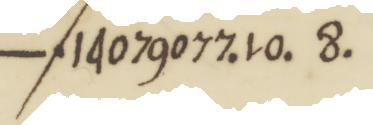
ƒ14079077.10. 8
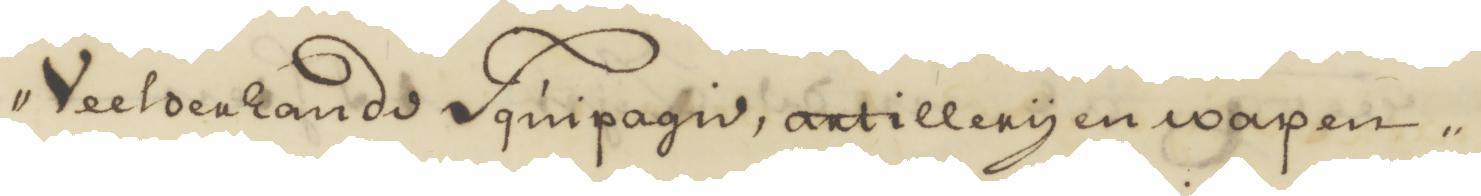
„ Veelderhande Equipagie, artillerij en wapen„
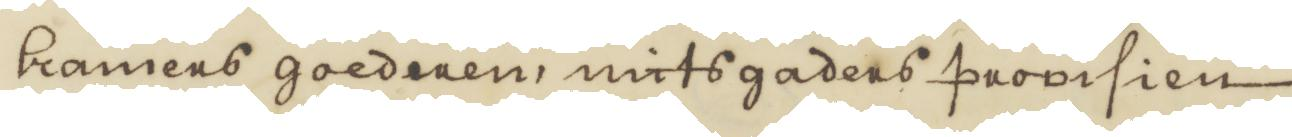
kamers goederen, mitsgaders provisien
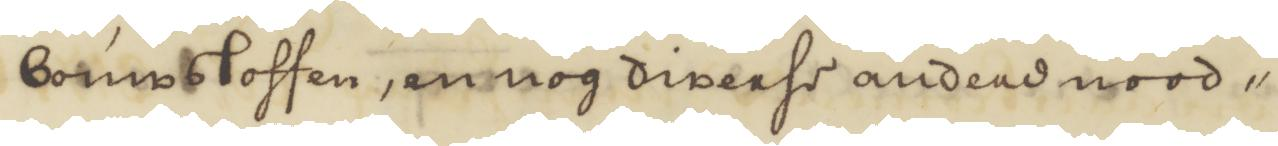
bouwstoffen, en nog diverse andere nood„
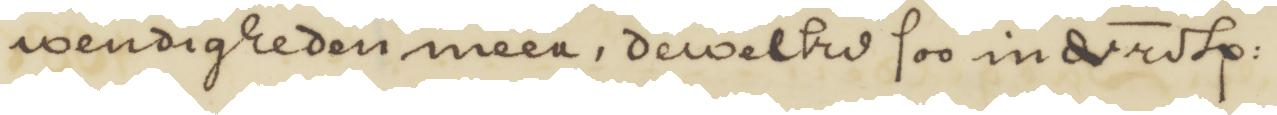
wendigheden meer, dewelke soo in de resp:
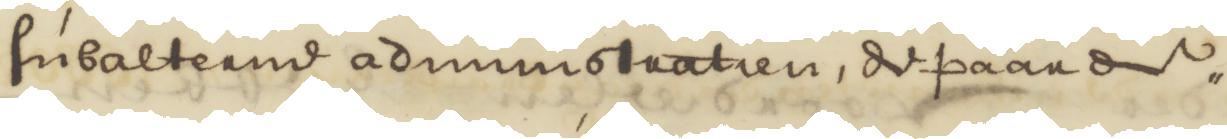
subalterne administratien, de paarde„
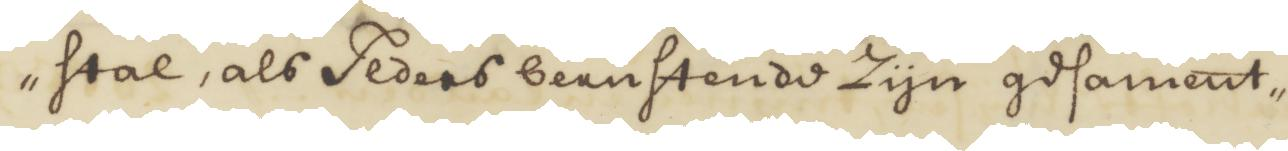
„stal, als Elders berustende zijn gesament„
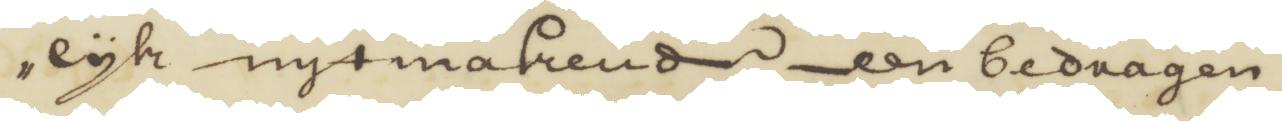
„lijk uijtmakende een bedragen.
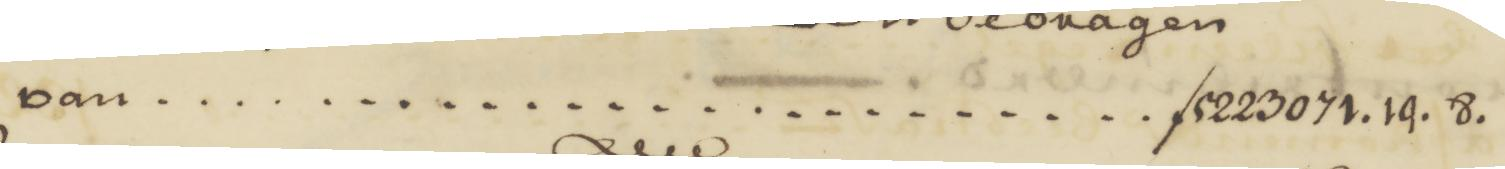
van. . . . . . . . . . . . . . . . . . . . . . . . . ƒ5223071.14.8.
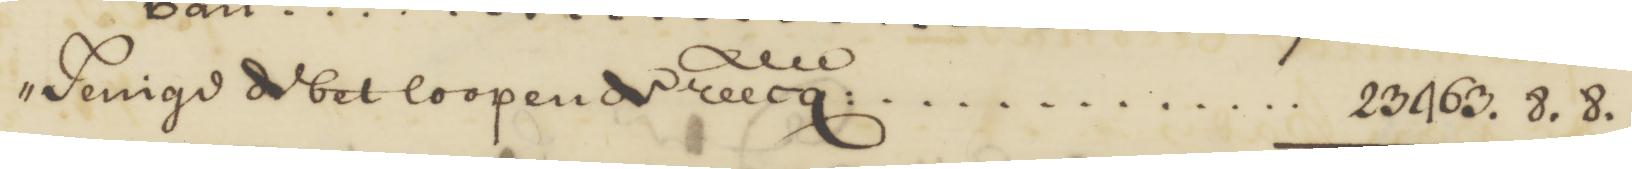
„ Eenige debet loopende reecq: . . . . . . . . . . . . 23463. 8. 8.
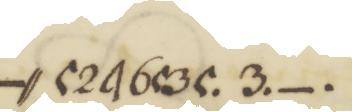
„5246535. 3.-.
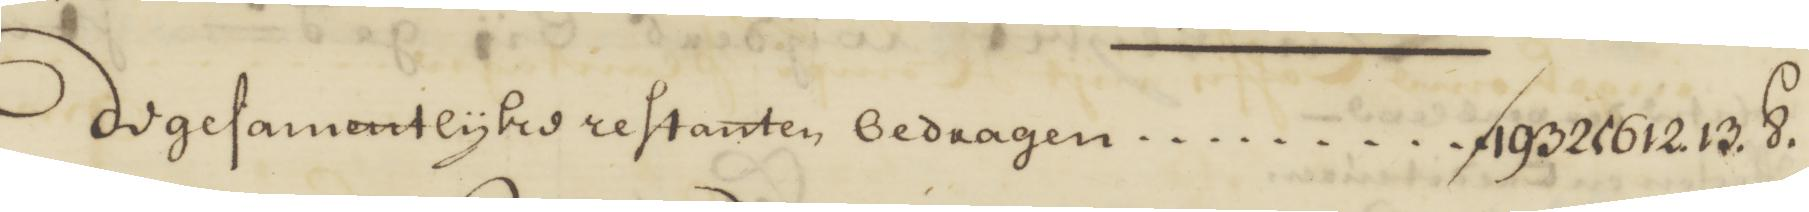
de gesamentlijke restanten bedragen . . . . . . . . . ƒ19325612.13.8.
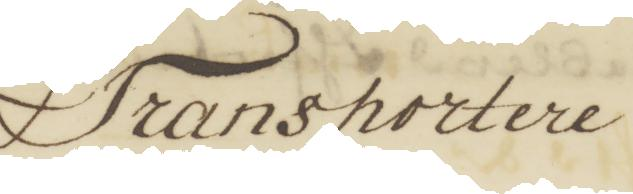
Transportere
